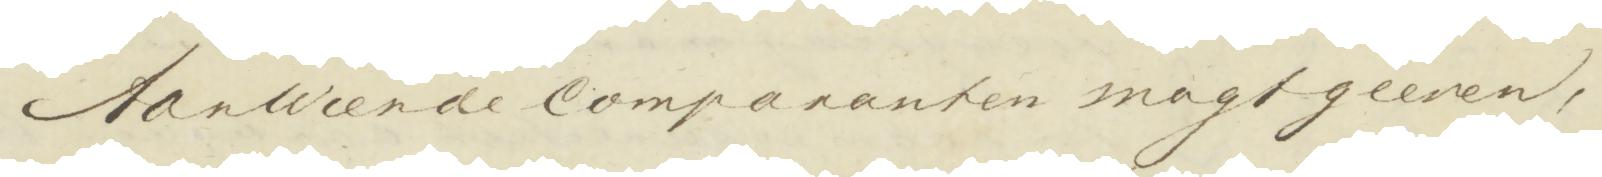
Aan wien de Comparanten magt geeven,
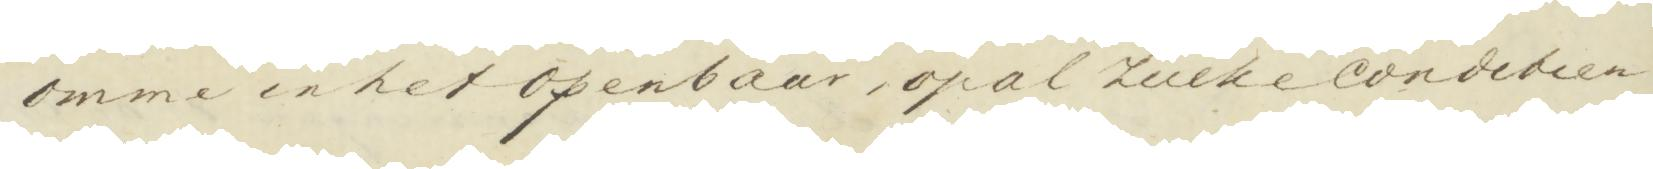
omme in het openbaar, op al zulke conditien
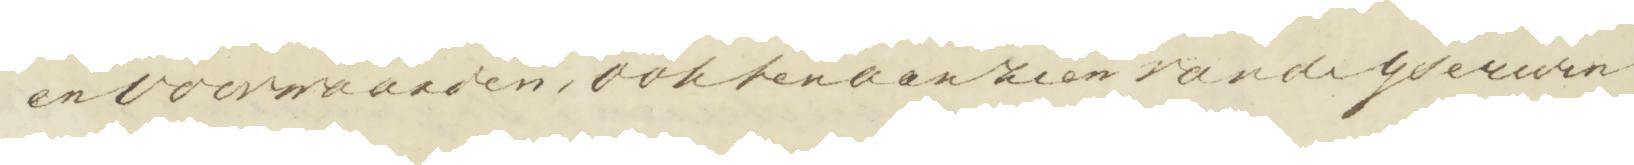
en voorwaarden, ook ten aanzien van de yserwin
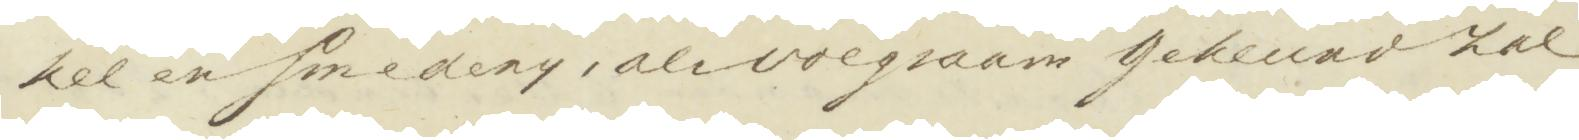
kel en smedery, als voegsaam gekeurd zal
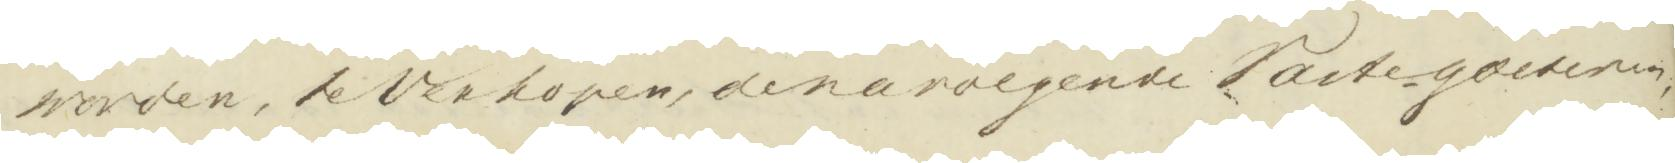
worden, te verkopen, de na volgende Vaste goeteren
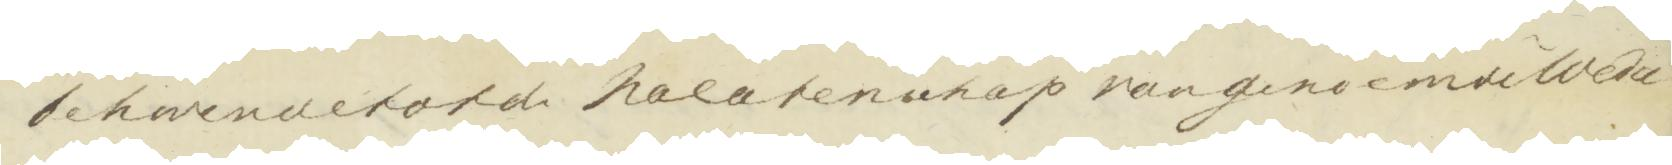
behorende tot de nalatenschap van genoemde wedu
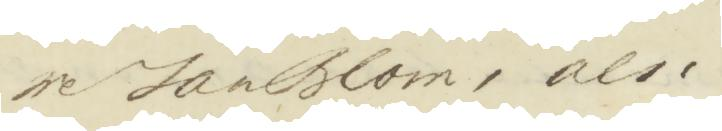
we Ian Blom, als.
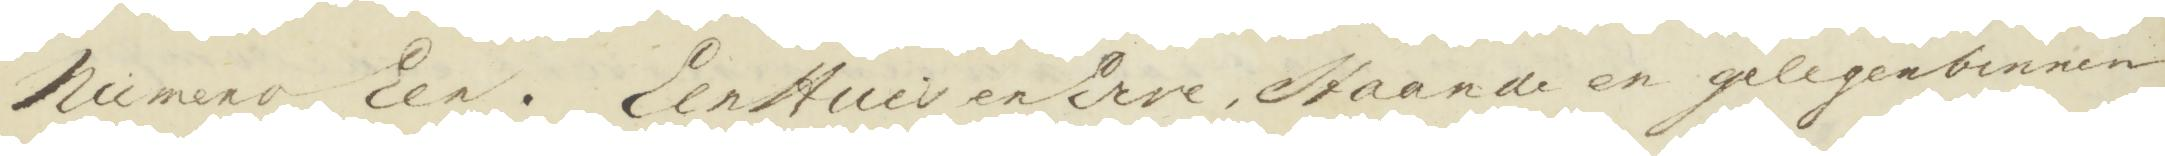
Numero Een. Een Huis en Erve, staande en gelegen binnen
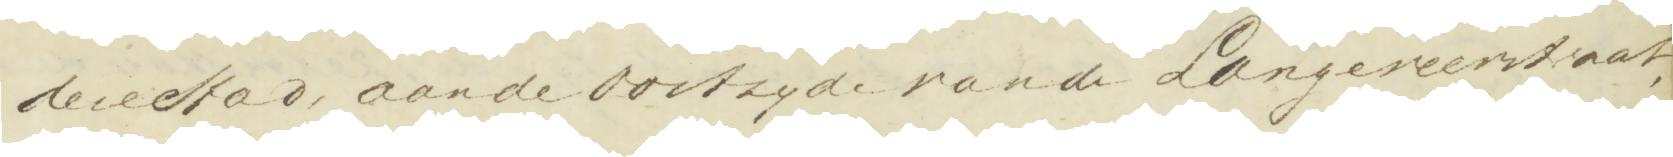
dese stad, aan de Oostzyde van de Langeveerstraat
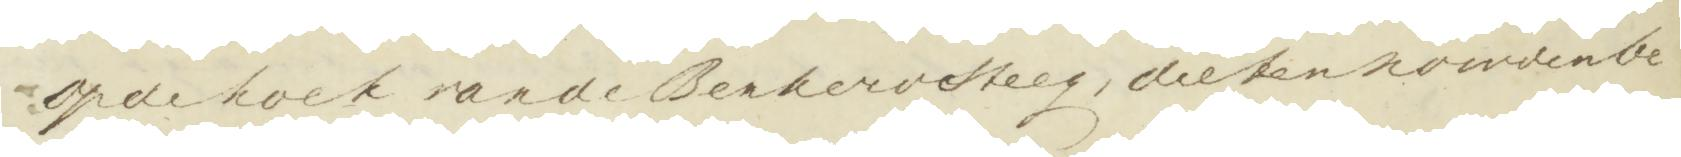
op de hoek van de Berkerosteeg, die ten noorden be
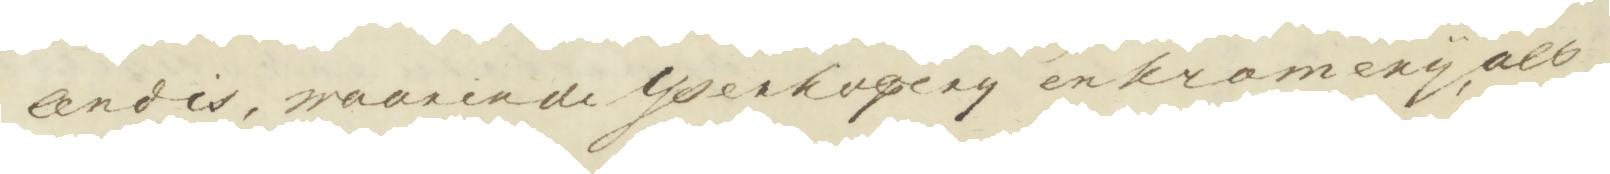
lend is, waarin de yserkopery en kramerij, als
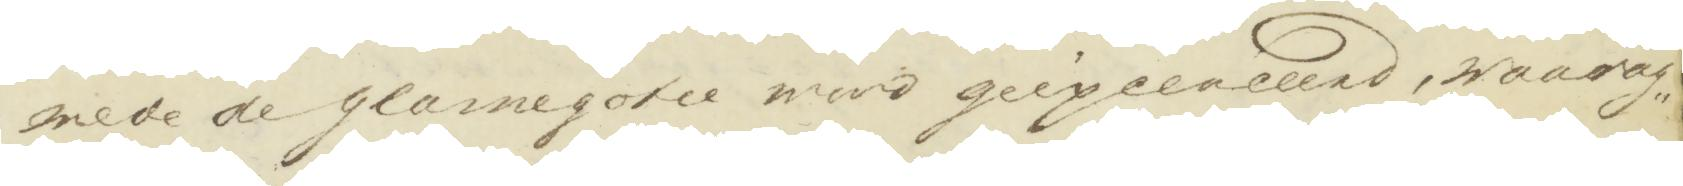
mede de glasnegotie word geexcerceerd, waarag„
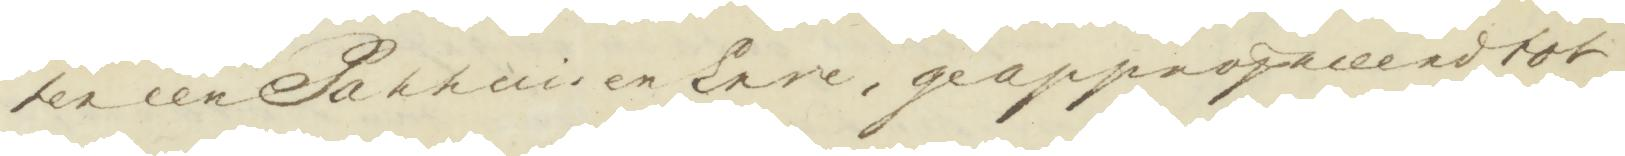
ter een Pakhuis en Erve, geapproprieerd tot
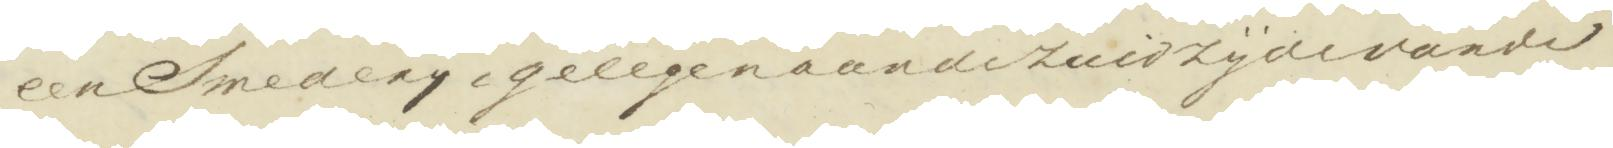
een Smederij, gelegen aan de zuidzijde van de
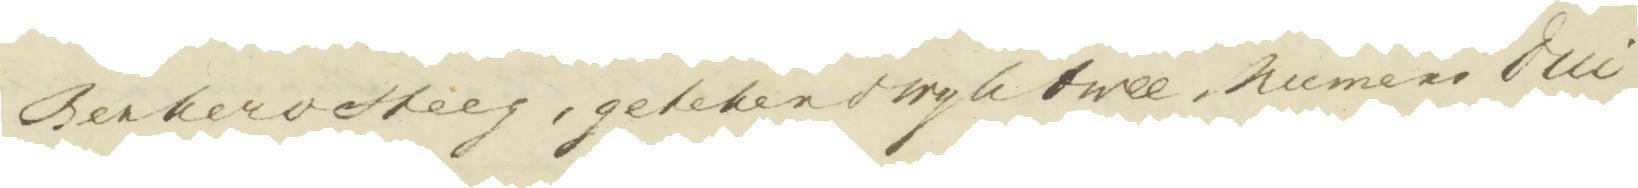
Berkerosteeg, getekend wyk twee, numero dui
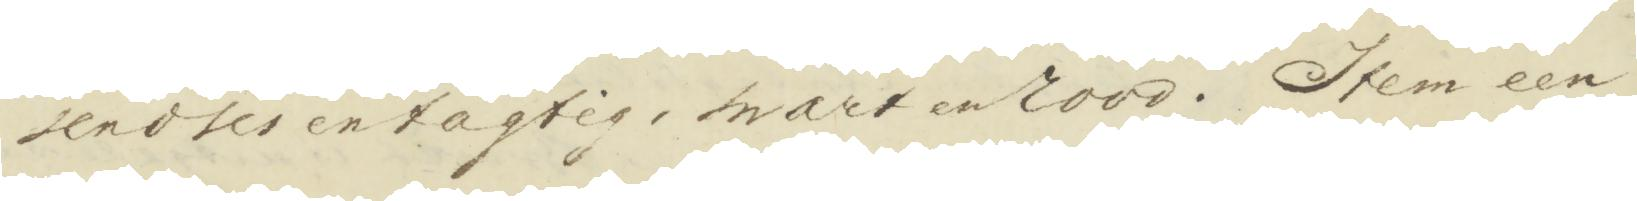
send ses en tagtig, swart en rood. Item een
